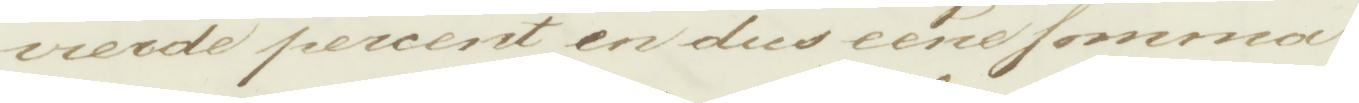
vierde percent en dus eene somma
